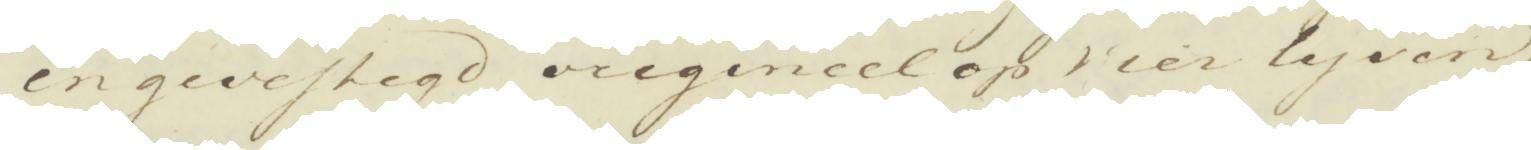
en gevestigd origineel op vier lyven
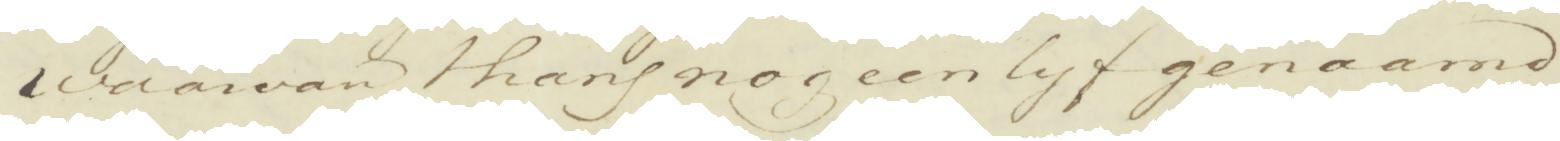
waarvan thans nog een lyf genaamd
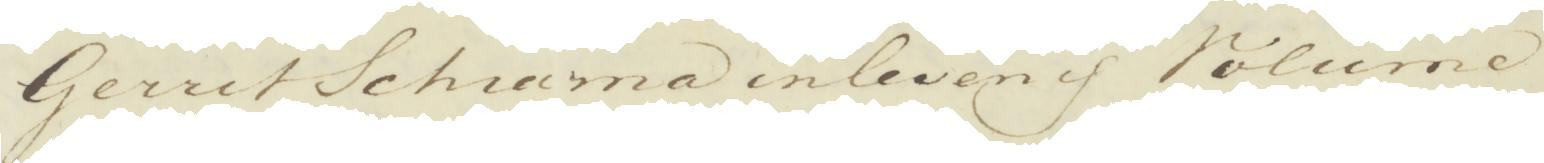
Gerrit Schrama in leven is Volume
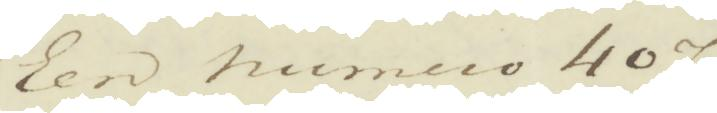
Een numero 407.
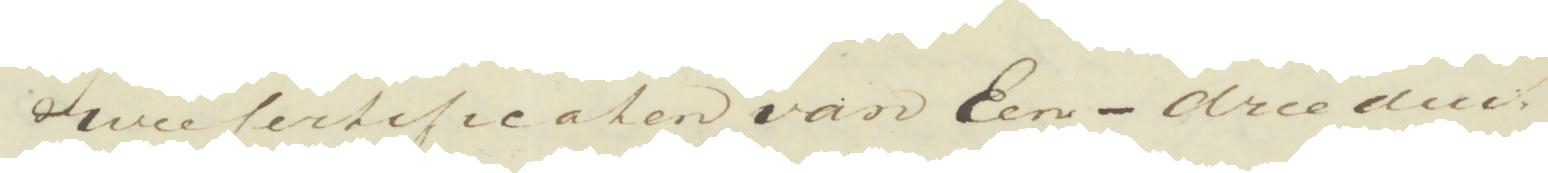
Twee Certificaten van Een - drie dui„
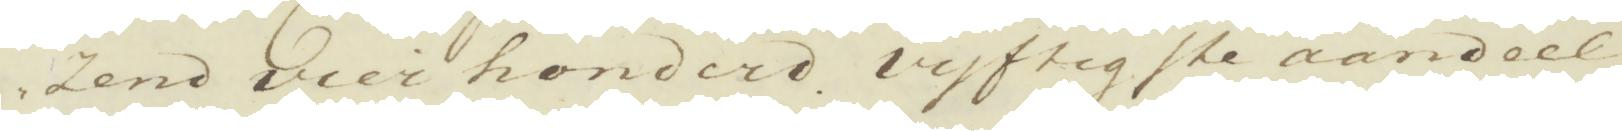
„zend vier honderd vjftig ste aandeel
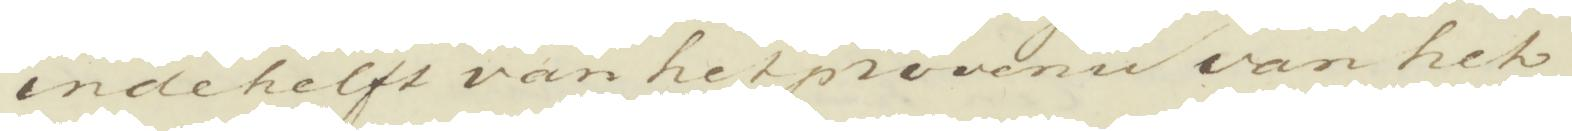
in de helft van het provenu van het
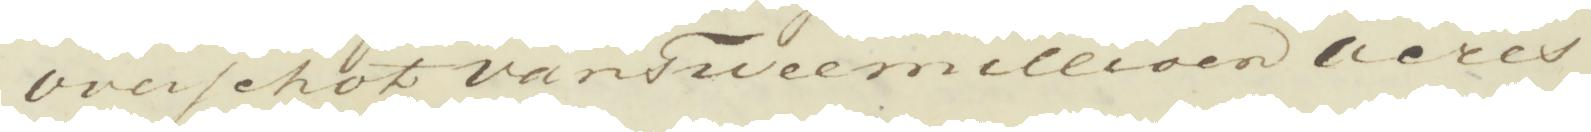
overschot vanTwee millioen acres
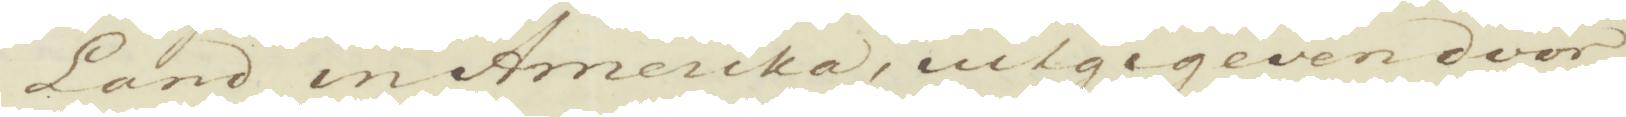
Land in Amerika, uitgegeven door
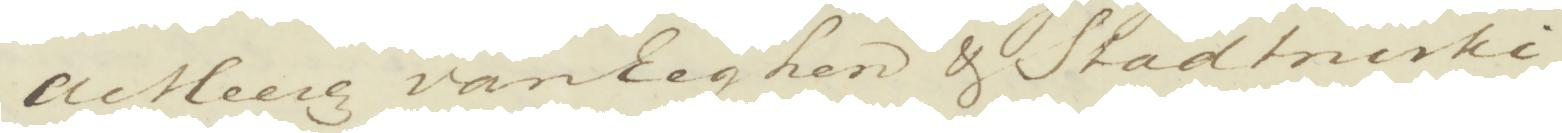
deHeeren van Eeghen & Stadtniski
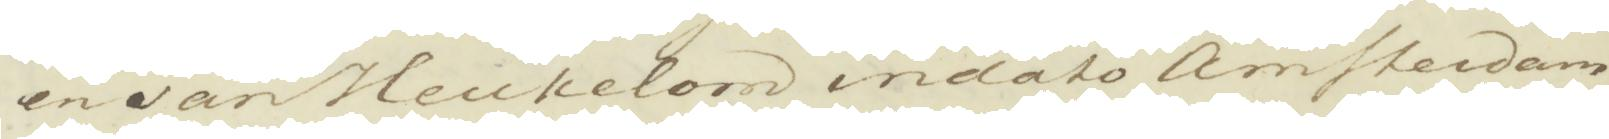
en van Heukelom indato Amsterdam
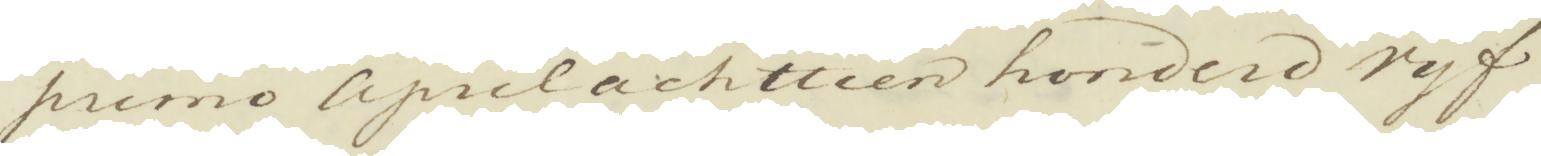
primo april achttien honderd vyf
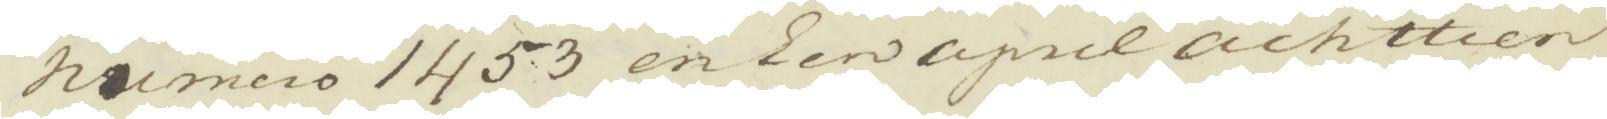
Numero 1453 en Een april achttien
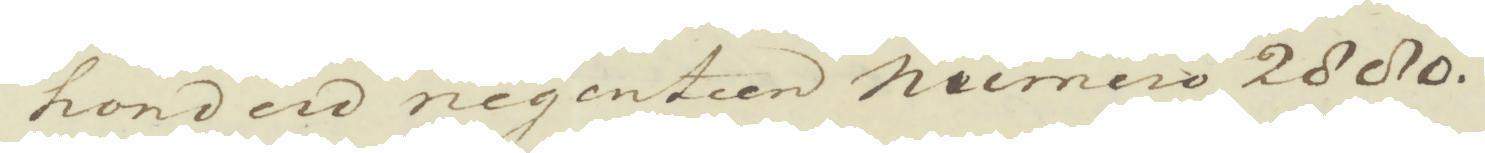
honderd negentien Numero 2880.
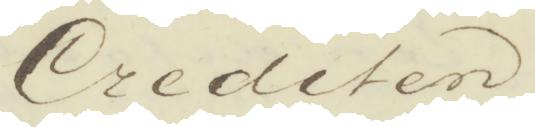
Crediten
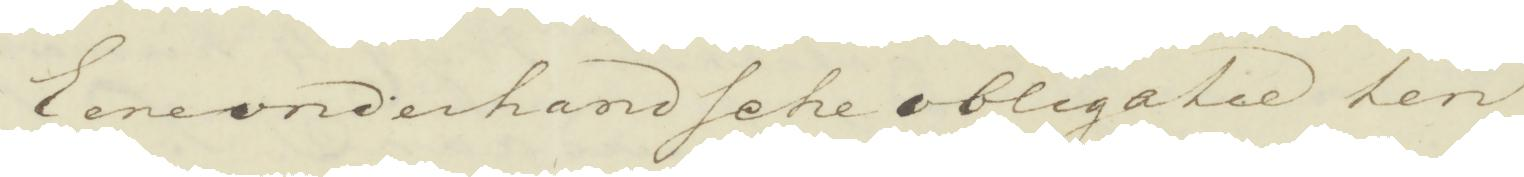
Eene onderhandsche obligatie ten
